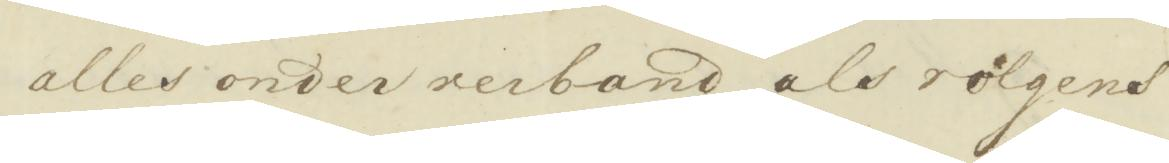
alles onder verband als volgens
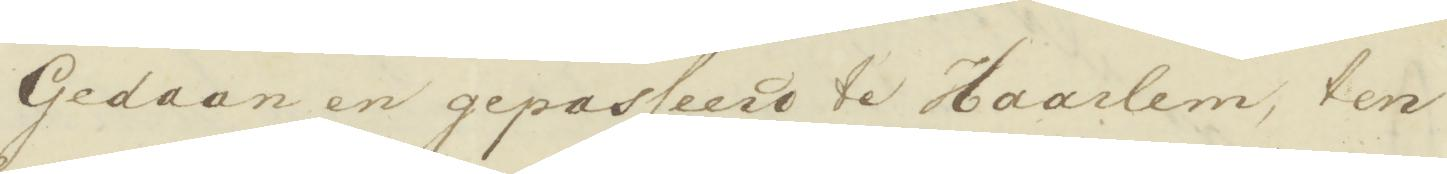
Gedaan en gepasseerd te Haarlem, ten
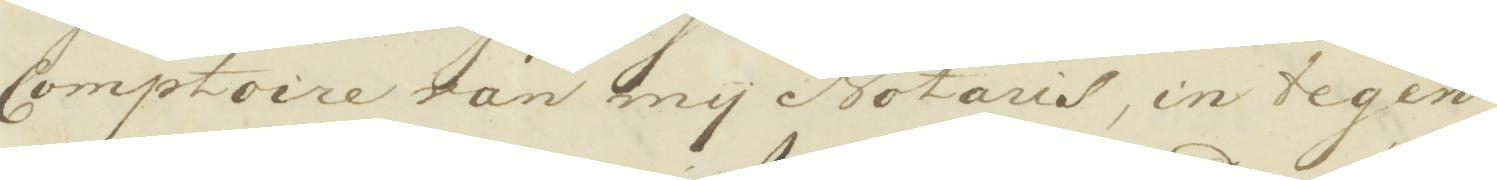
Comptoire van mij Notaris, in tegen
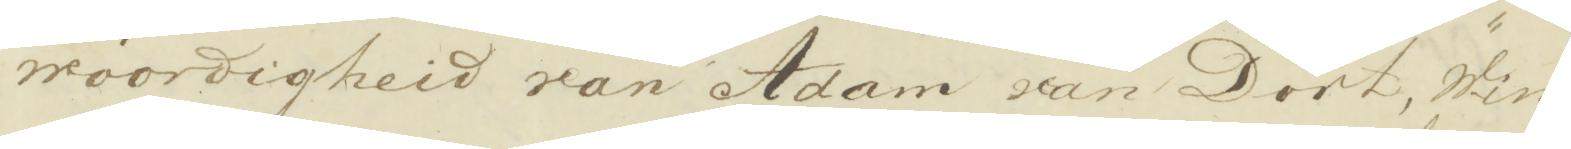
woordigheid van Adam van Dort, win
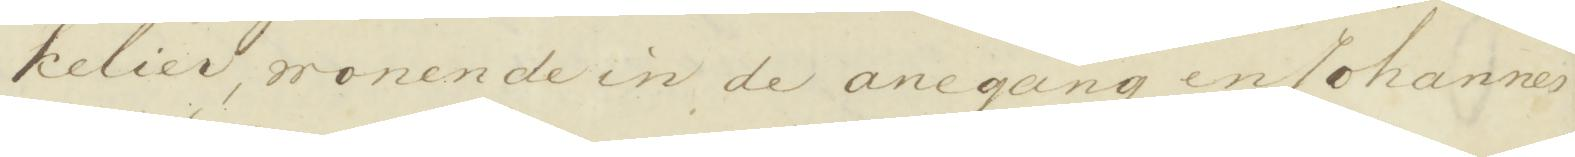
kelier, wonende in de anegang en Johannes
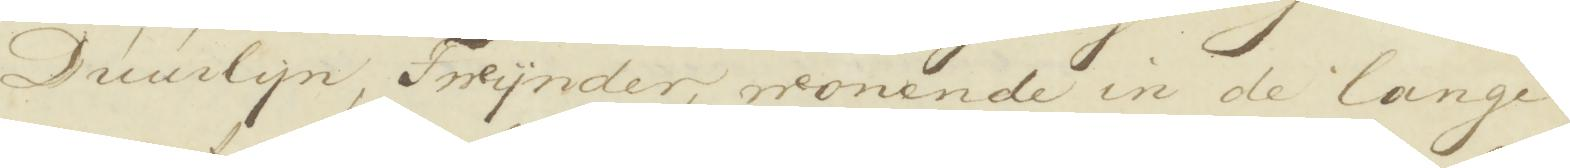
Duurlijn, Twijnder, wonende in de lange
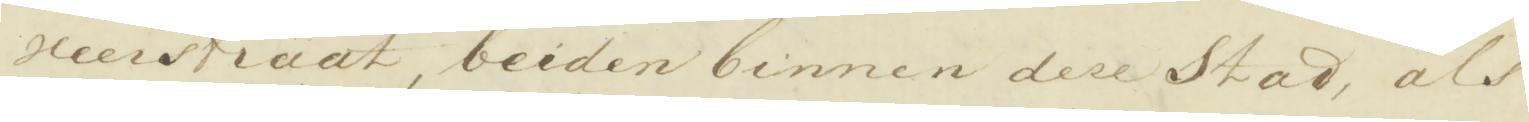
veerstraat, beiden binnen deze Stad, als
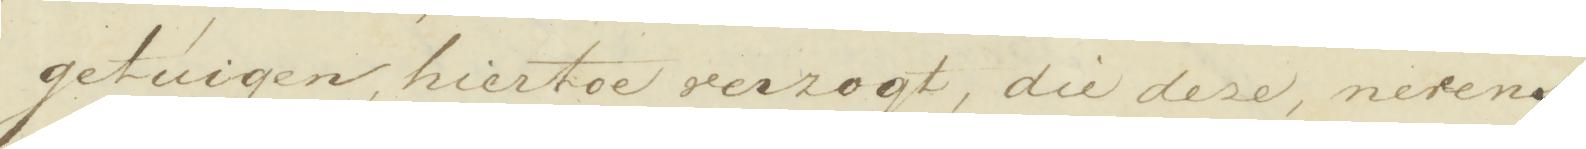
getuigen, hiertoe verzogt, die deze, nevens
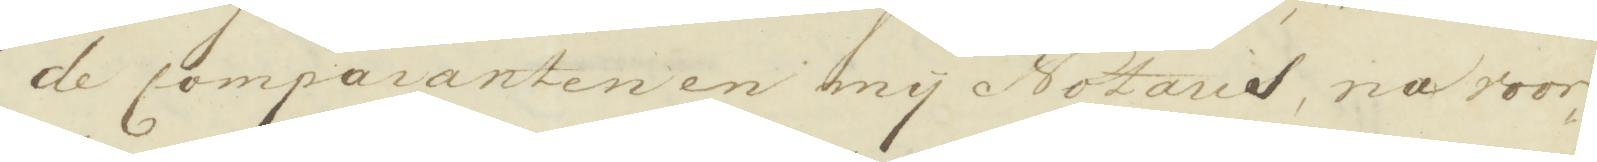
de Comparanten en mij Notaris, na voor„
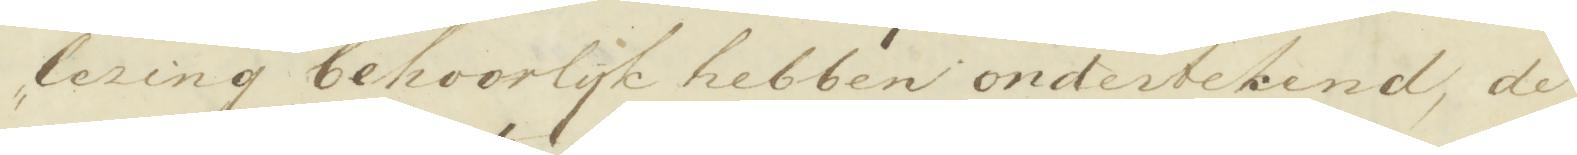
„lezing behoorlijk hebben ondertekend, de
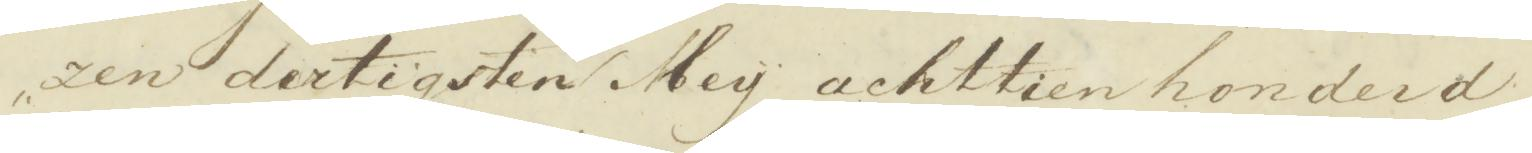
„zen dertigsten Meij achttien honderd
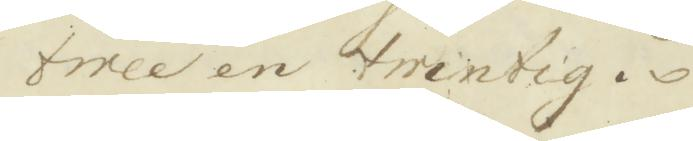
twee en twintig.
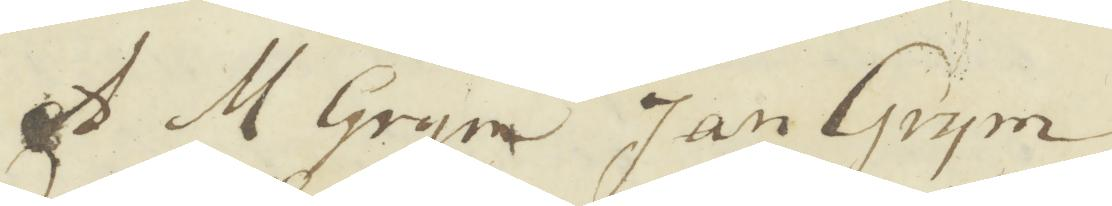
A M Grym Jan Grym
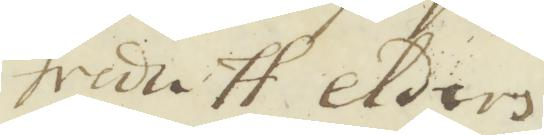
Wedu H elders
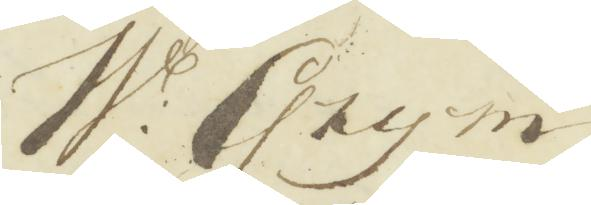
W: Grym
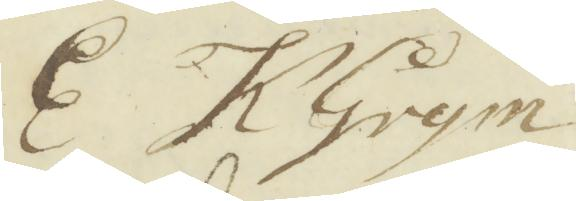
E K Grijn
